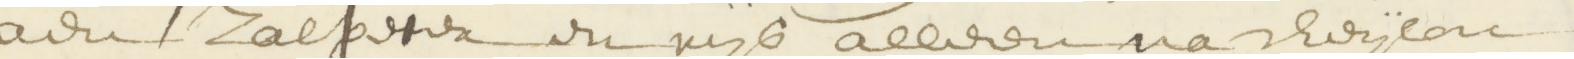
aen zalpeter en rijs alleen na cheijlon
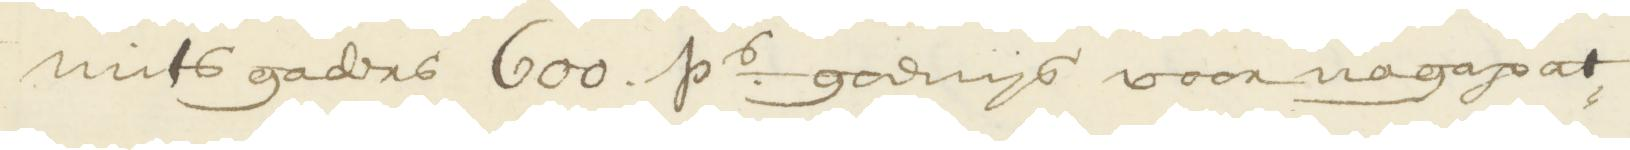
mitsgaders 600. p:s goenijs voor nagapat„
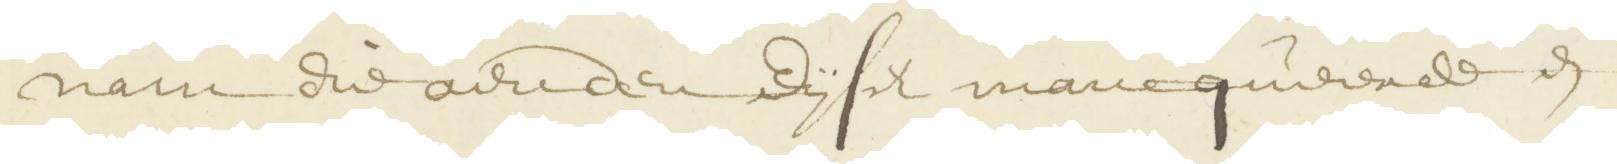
nam die aen den Eijsch mancqueerde en
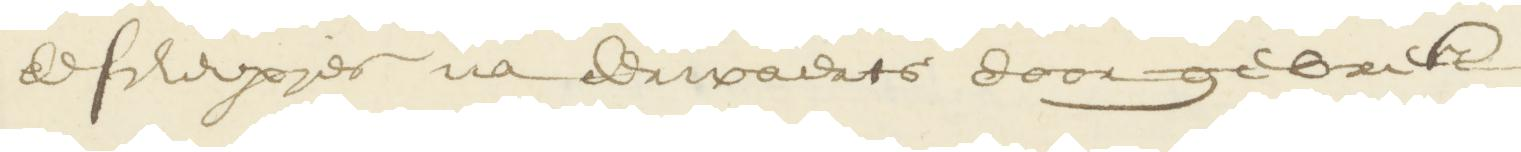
de scheepjes na derwaerts door gebrek
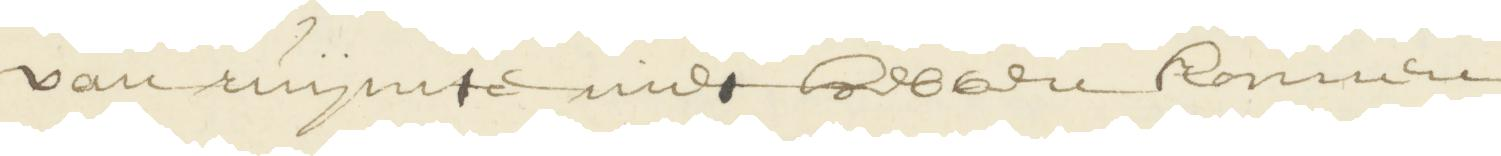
van ruijmte niet hebben konnen
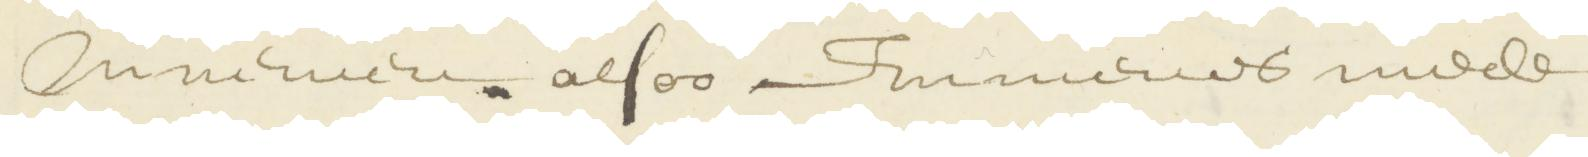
jnnemen alsoo Emmenes mede
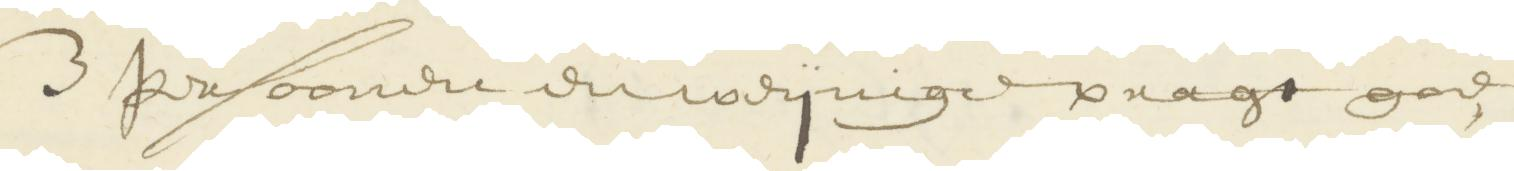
3 persoonen en weijnige vragt goe„
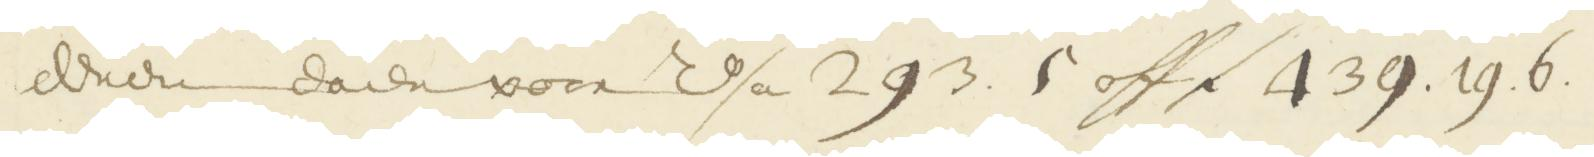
deren daer voor ro/a 293. 5 off ƒ 439.19.6.
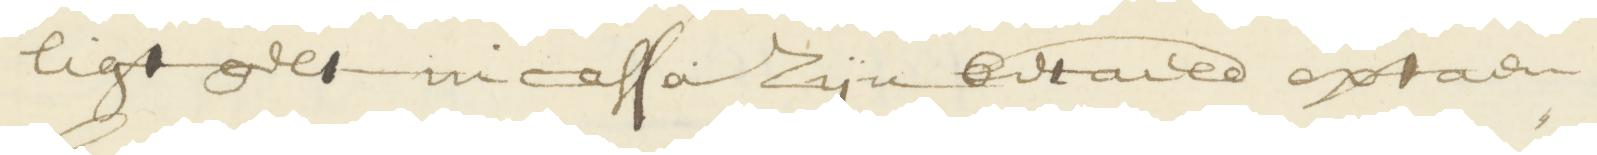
ligt gelt in cassa zijn betaeld op'taen
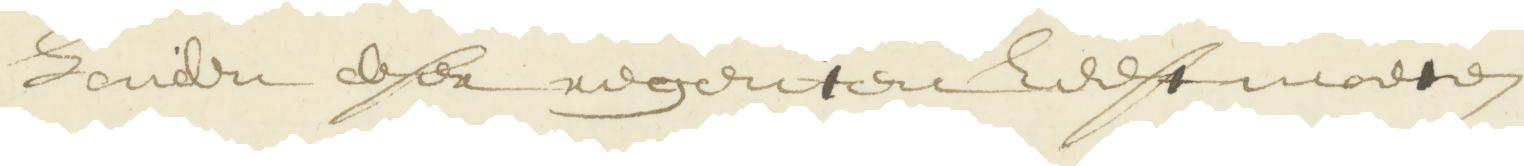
houden deser regenten heeft moete
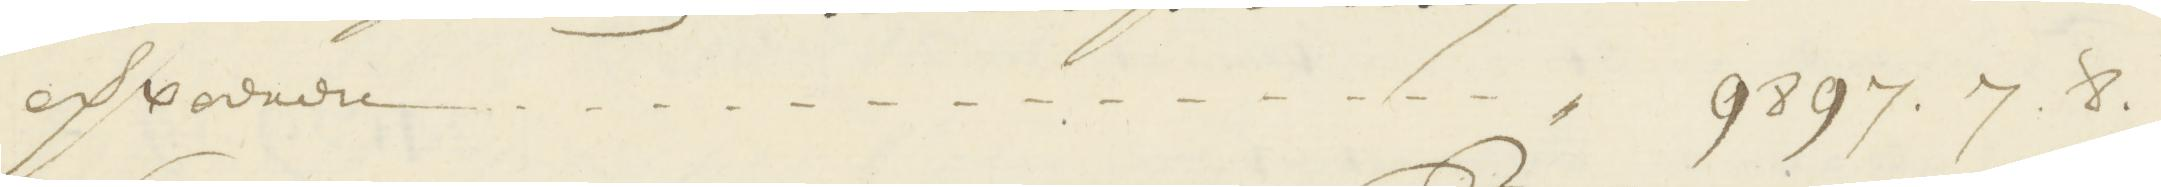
overvoeren - - - - - - - - - - - - - - „ 9897.7.8.
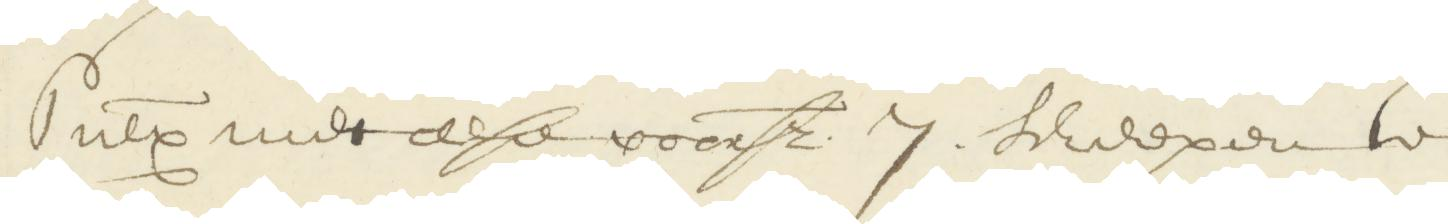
Sulx met dese voorsz: 7. scheepen te
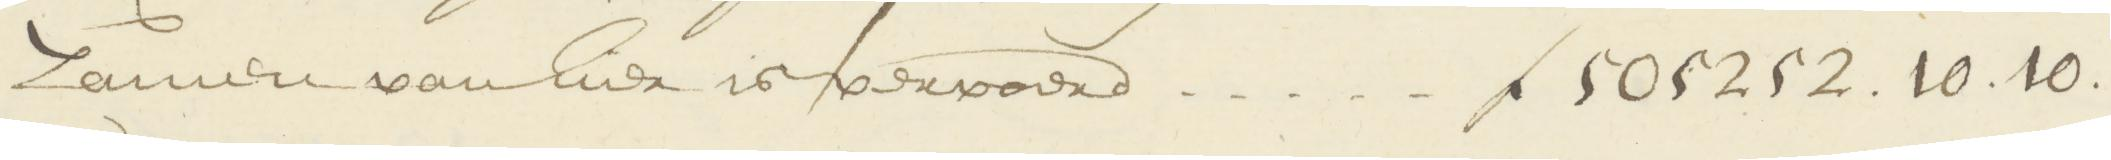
Zamen van hier is vervoerd - - - - - ƒ505252. 10. 10.
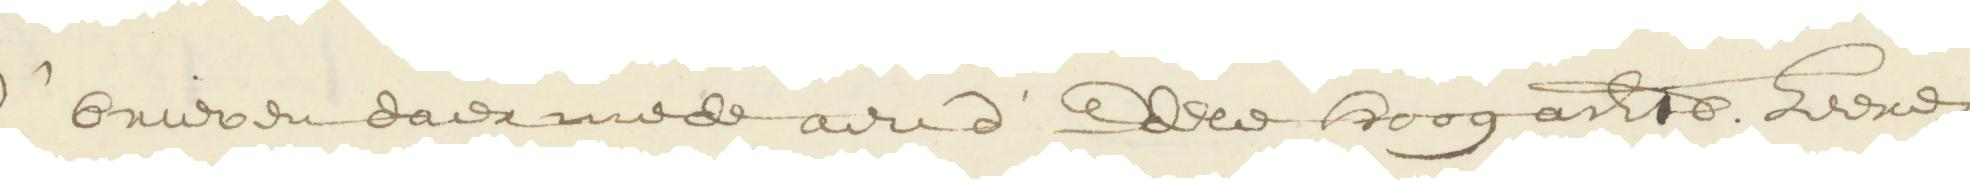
' brieven daer mede aen d’ Edele hoog achtb. heere
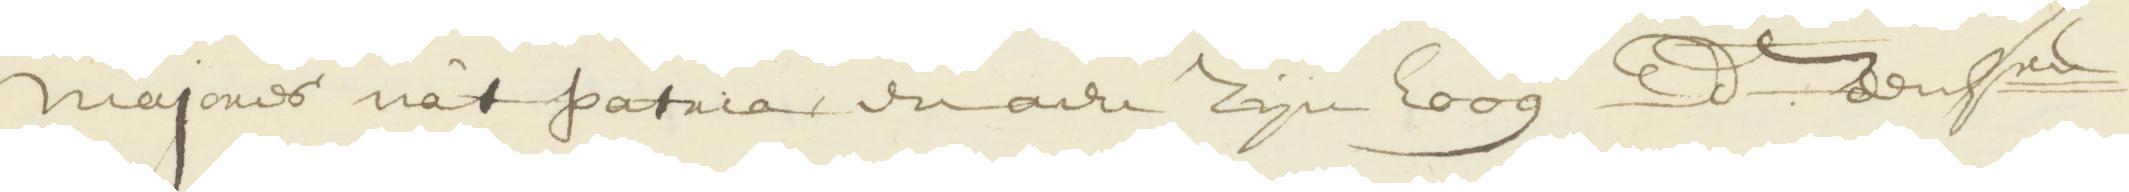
majores na't patria, en aen zijn hoog Ed=l den ver=re
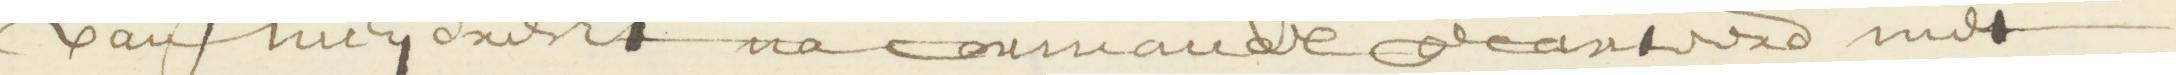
van meijdrecht na cormandel gecarteerd met
